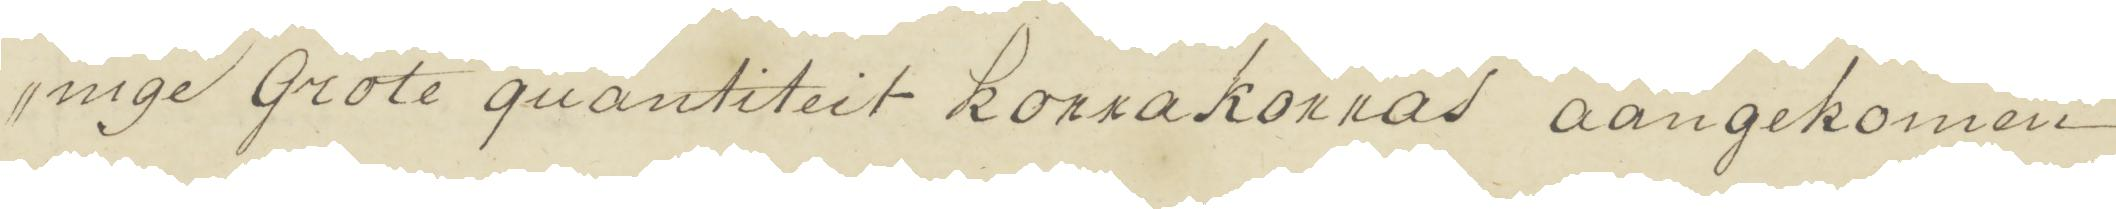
„nige Grote quantiteit korra korras aangekomen
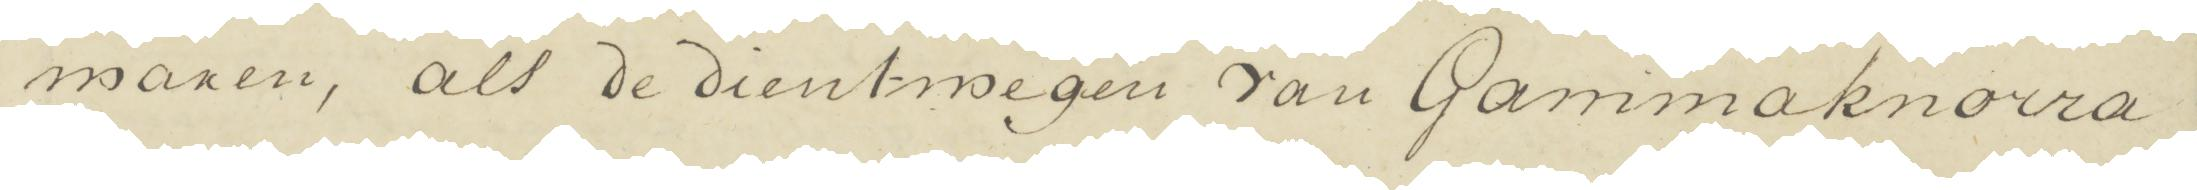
waren, als de dientwegen van Gamma knorra
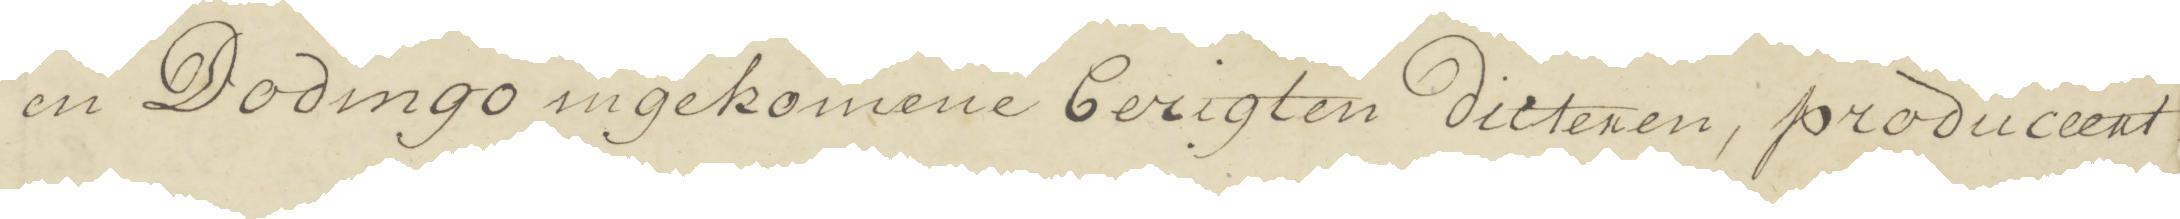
en Dodingo ingekomene berigten dicteren, produceert
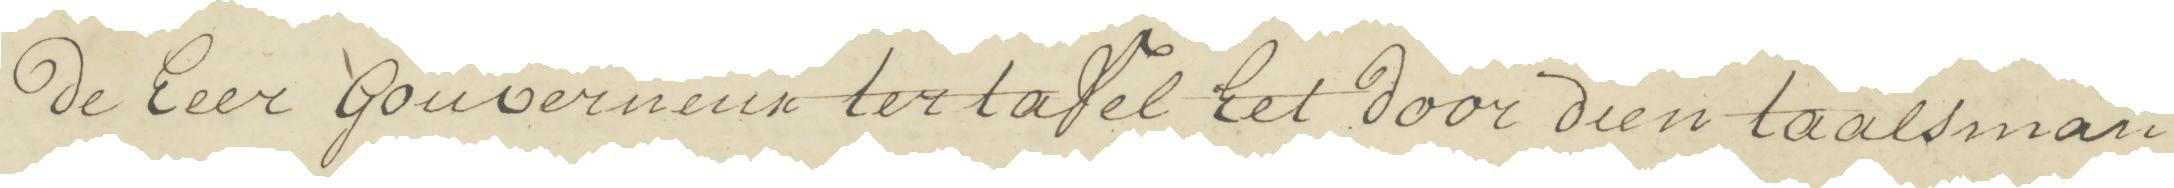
de heer Gouverneur ter tafel het door dien taalsman
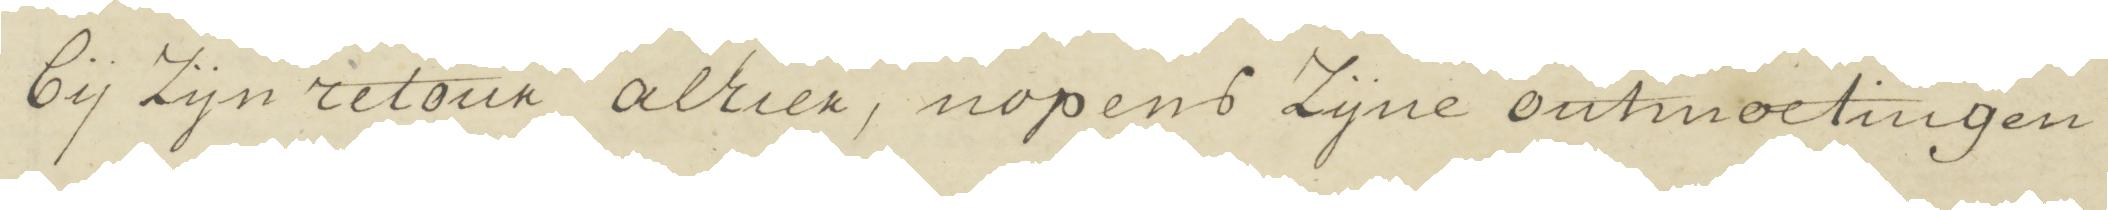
bij Zijn retour alhier, nopens Zijne ontmoetingen
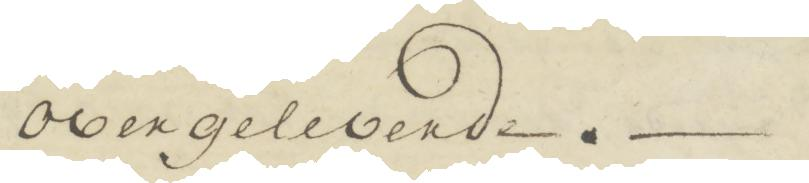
overgeleverde. —
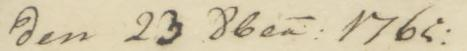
den 23 8ber: 1765:
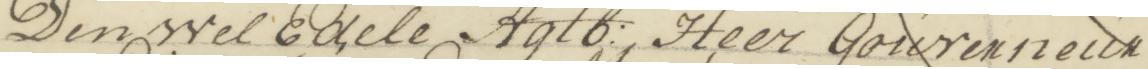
Den wel Edele Agtb: Heer Gouverneur
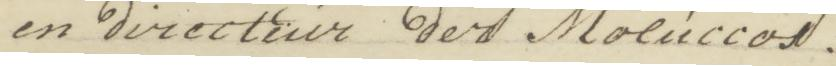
en directeur der Moluccos.
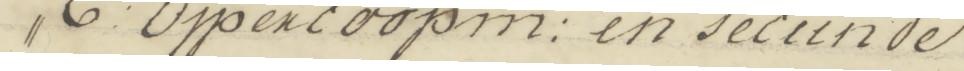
„E: Oppercoopm: en Secunde
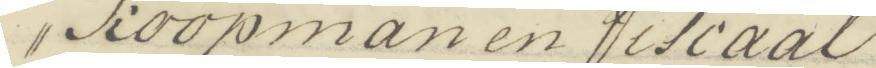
„Koopman en fiscaal
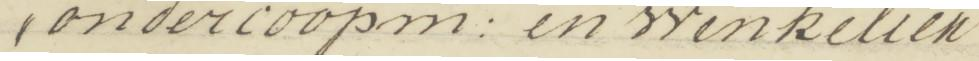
„ondercoopm: en winkelier
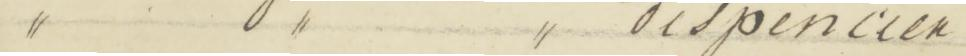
„ d„o „ dispencier
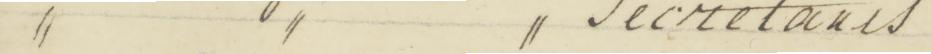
„ d„o Secretaris
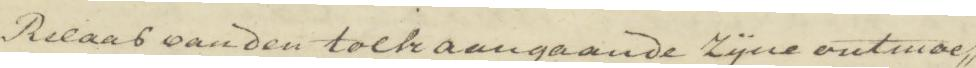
Relaas van den tolk aangaande Zijne ontmoe„
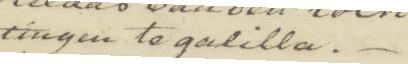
tingen te galilla.—
